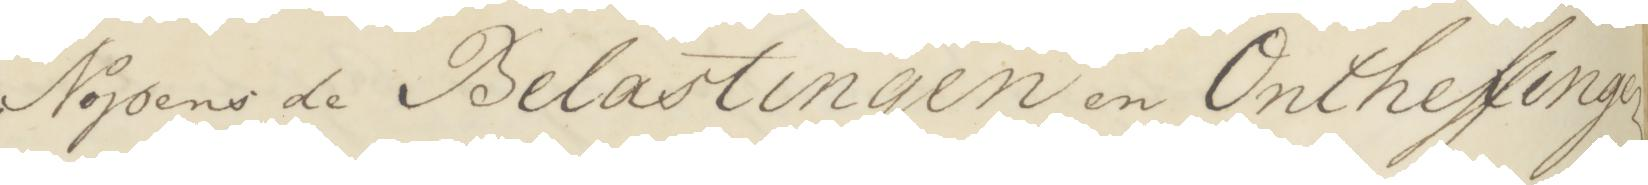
Nopens de Belastingen en Ontheffingen
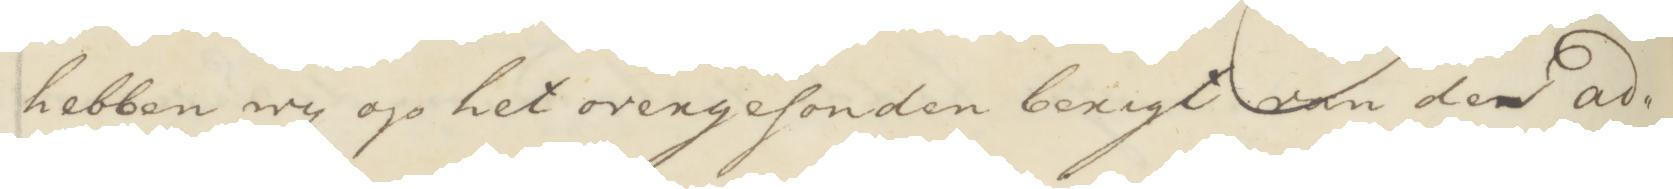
hebben wij op het overgesonden berigt van den ad„
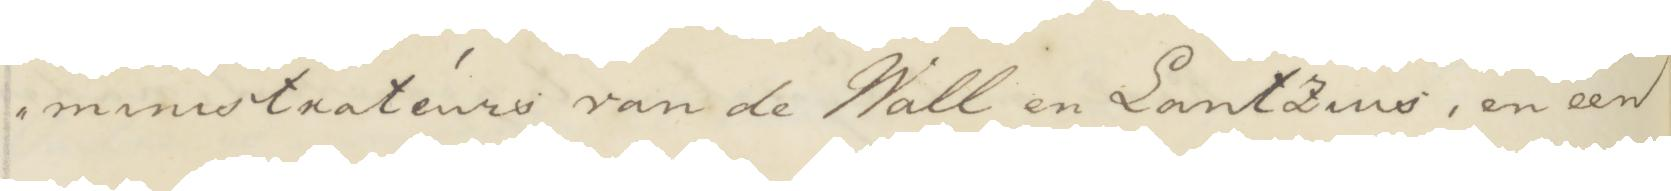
„ministrateurs van de Wall en Lantzius, en een
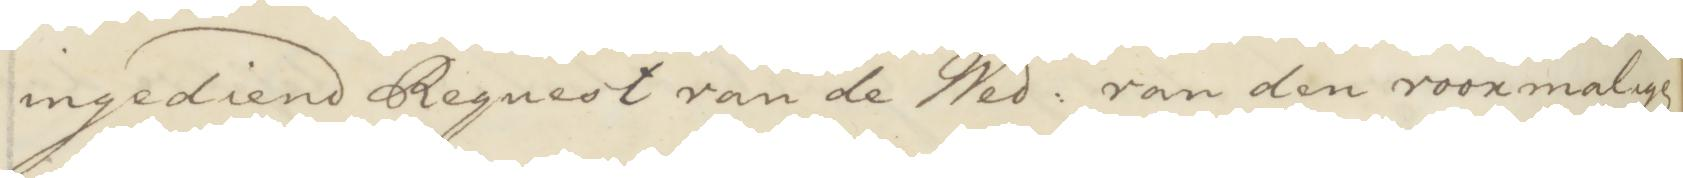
ingediend Request van de Wed: van den voormaligen
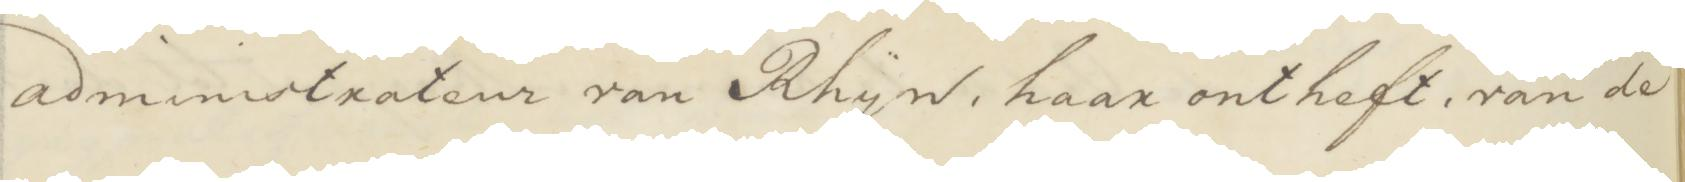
administrateur van Rhijn, haar ontheft, van de
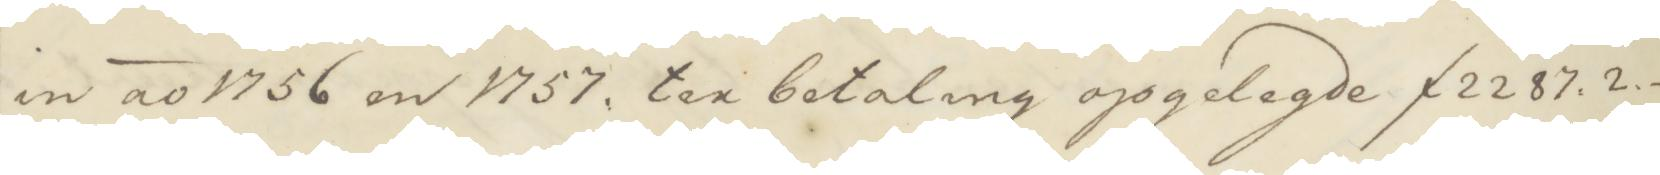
in ao 1756 en 1757: ter betaling opgelegde ƒ 2287:2:-
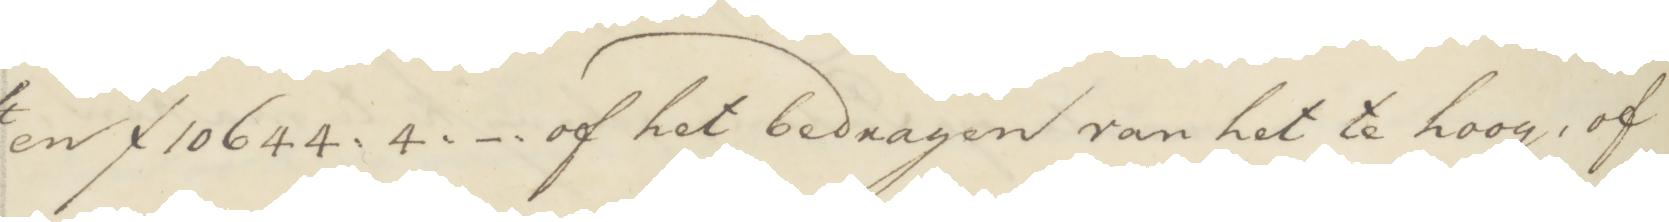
en ƒ 10644:4:4:-: of het bedragen van het te hoog, of
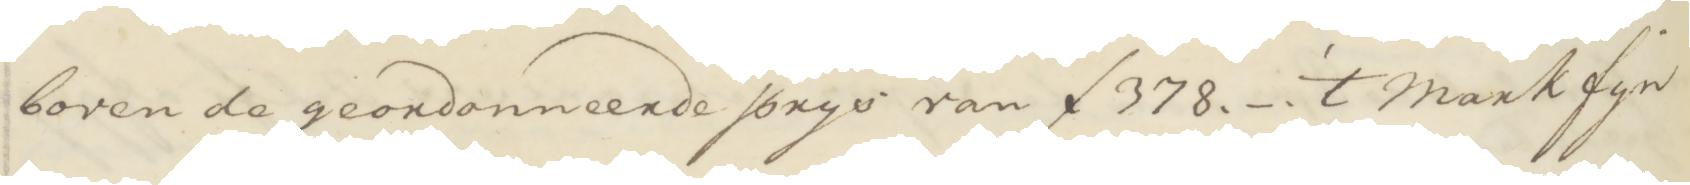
boven de geordonneerde prijs van ƒ 378:-: 't Mark fijn
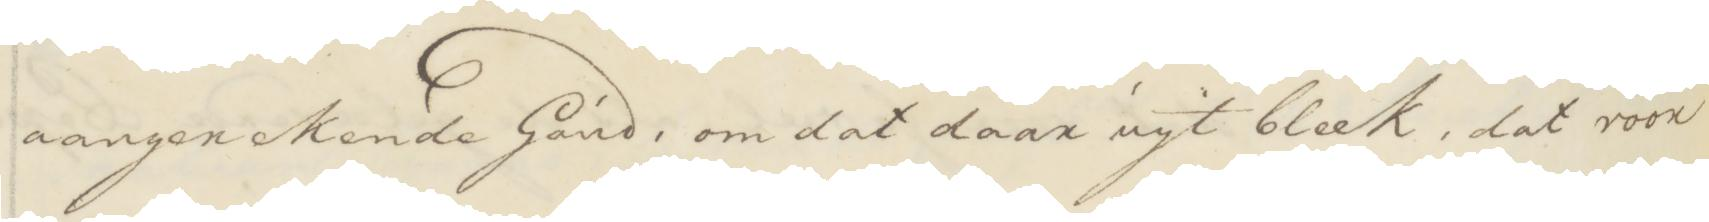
aangerekende goud, om dat daar uijt bleek, dat voor
